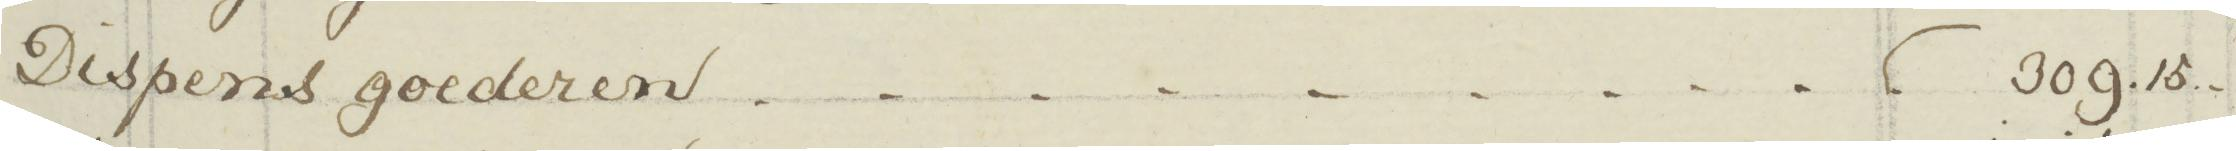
Dispens goederen - - - - - - - - - ƒ309:15.-
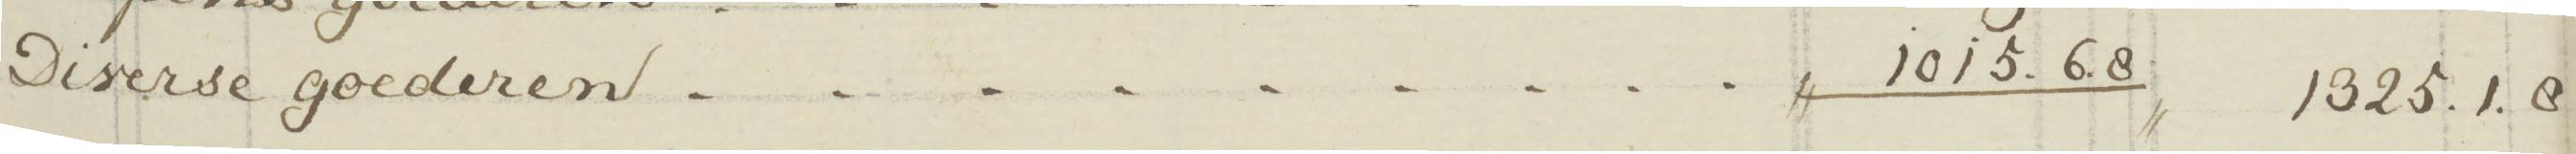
Diverse goederen - - - - - - - - - „1015. 6.8 „1325. 1. 8
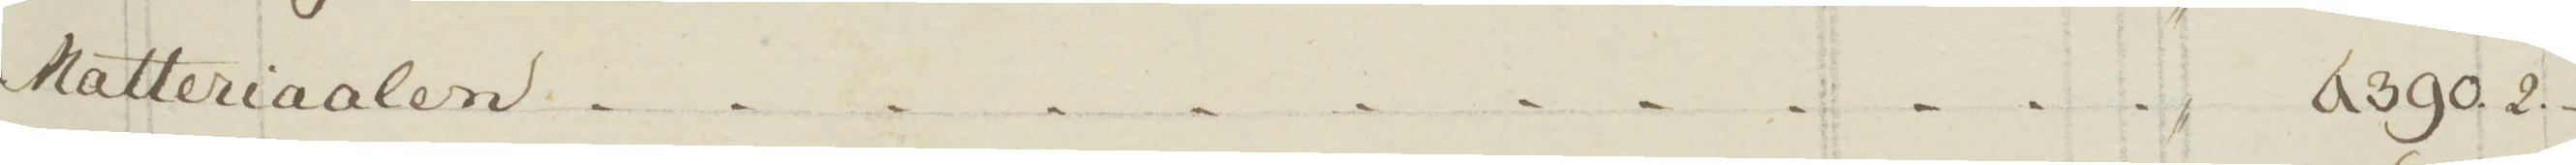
Matteriaalen - - - - - - - - - - - - „ 4390. 2.
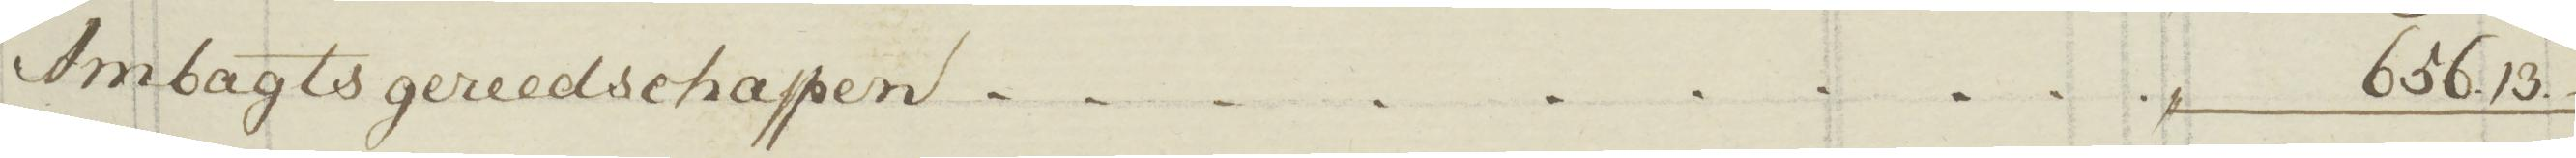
Ambagts gereedschappen - - - - - - - - - - „ 656.13.—
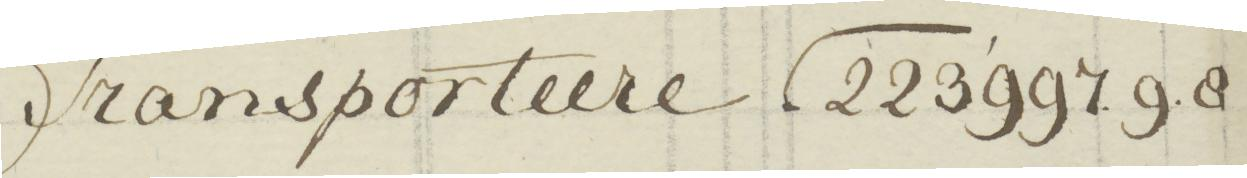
Transporteere ƒ 223'997. 9.8
